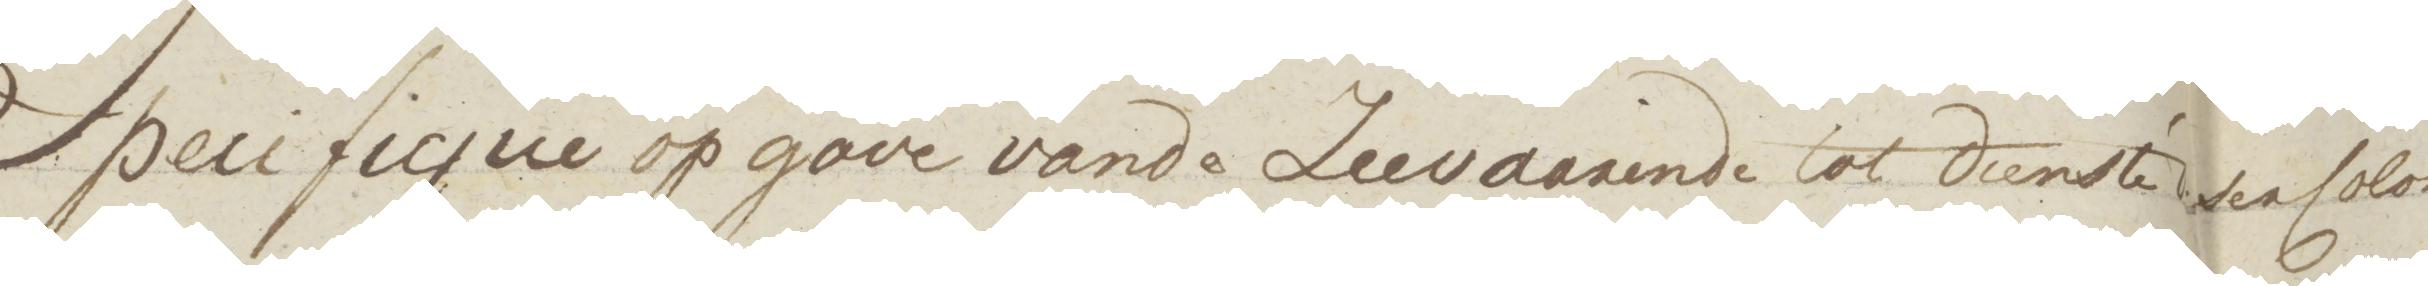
Specifique op gave vande Zeevaarende tot dienste der Colo
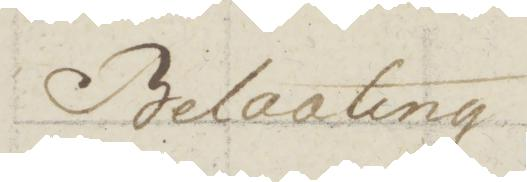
Belaating
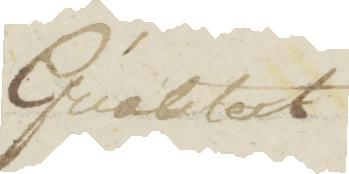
Qualiteit
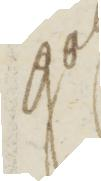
ga
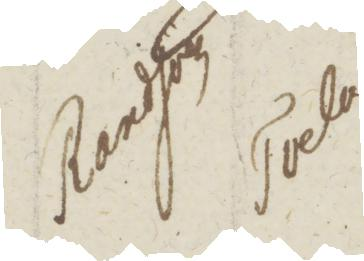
Randsoen Toela
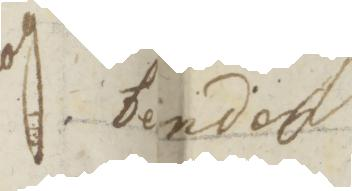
be nden
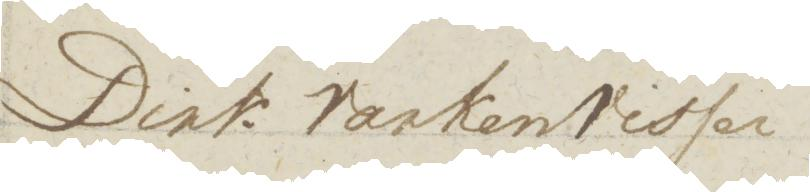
Dirk Varkenvisser
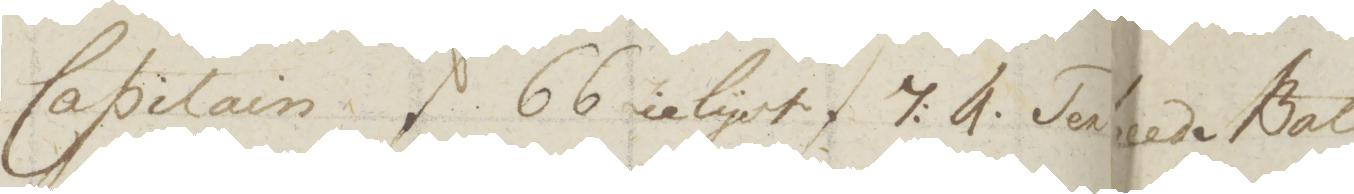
Capitain ƒ 66 zielijst ƒ 7:4: Ter eede Bal
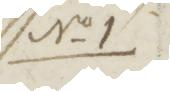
N_o 1
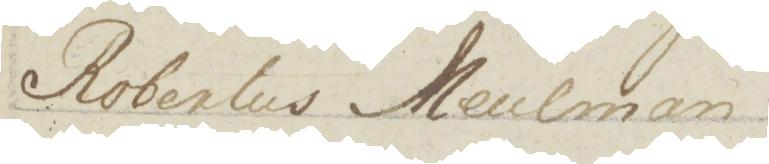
Robertus Meulman
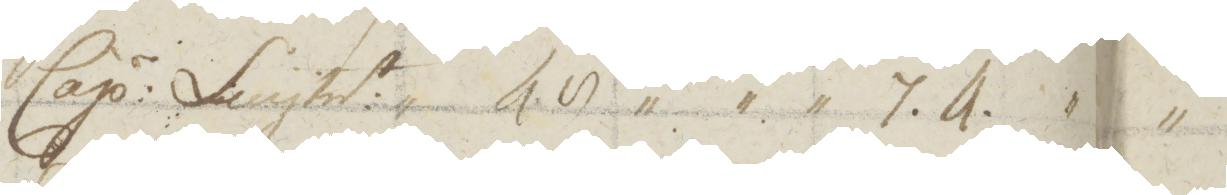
Cap:n Luijtn:t 48 „ „ „ 7.4. „ „
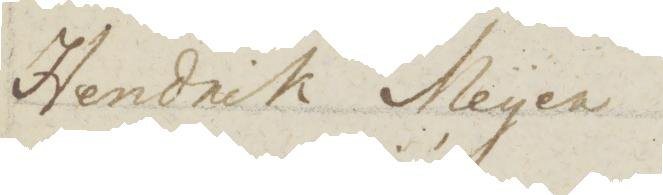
Hendrik Meijer
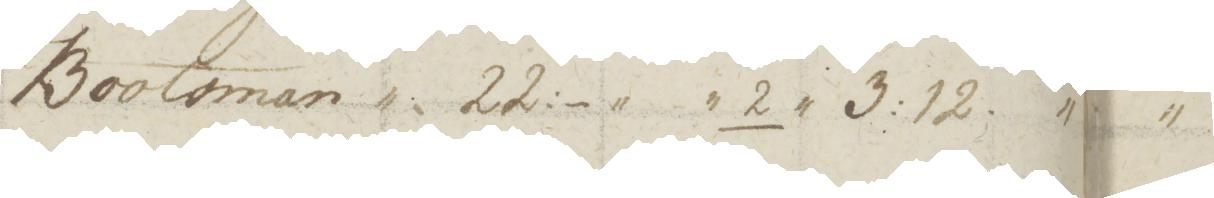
Bootsman „ 22:-„ „ 2 „ 3:12. „ „
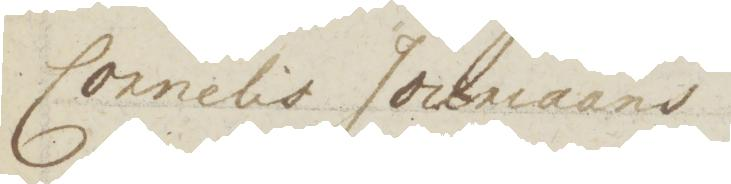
Cornelis Jouriaans
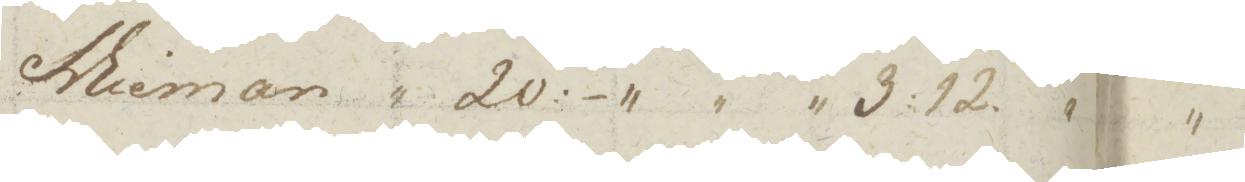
Schieman „ 20:-„ „ „ 3:12. „ „
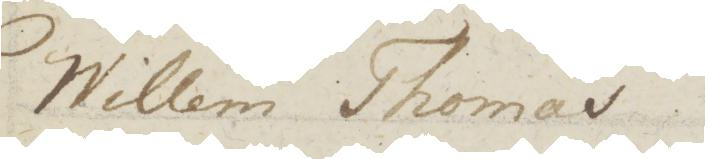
Willem Thomas
